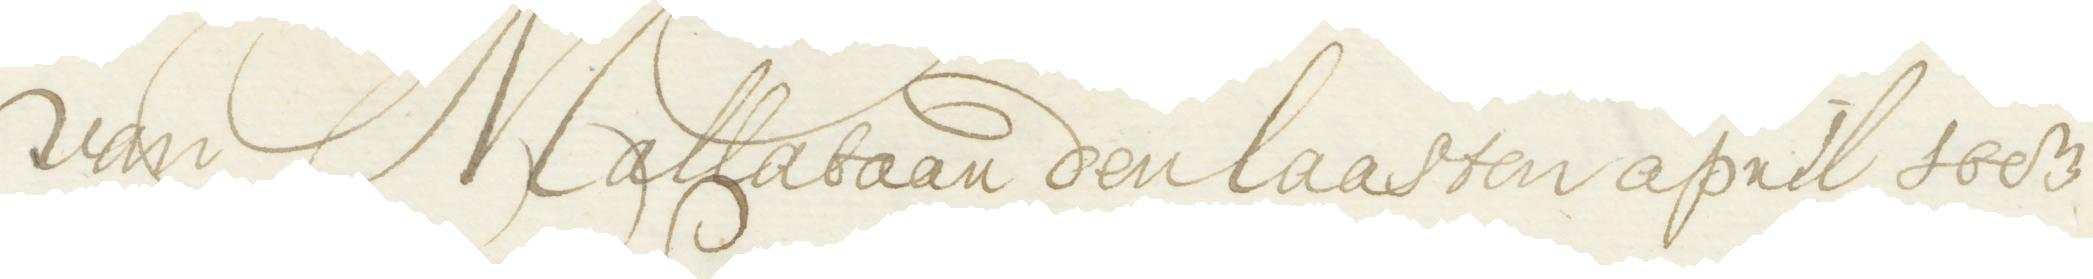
van Mallabaar den laasten april 1683
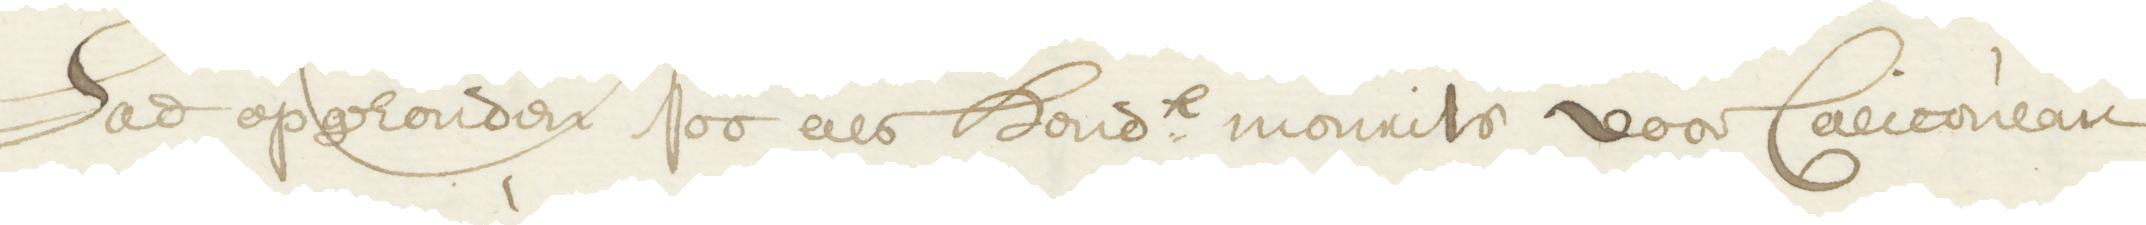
Had opgehouden Soo als Hend:K mourits voor Calicoulan
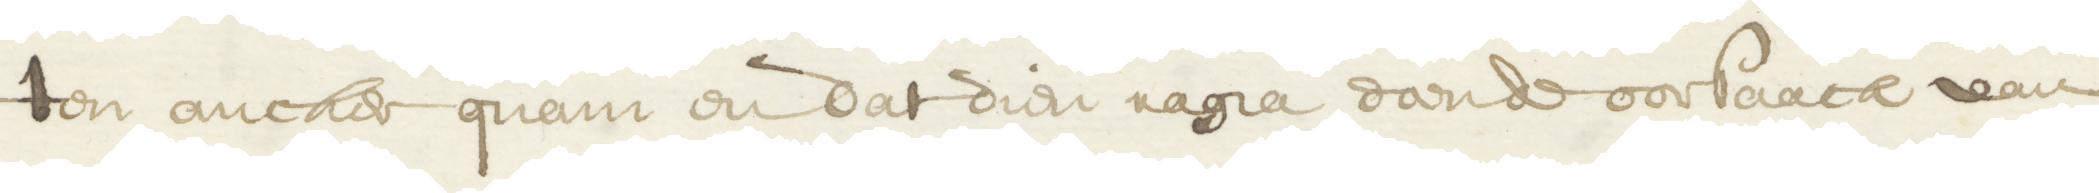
ten ancker quam en dat dien ragia doende oorsaack van
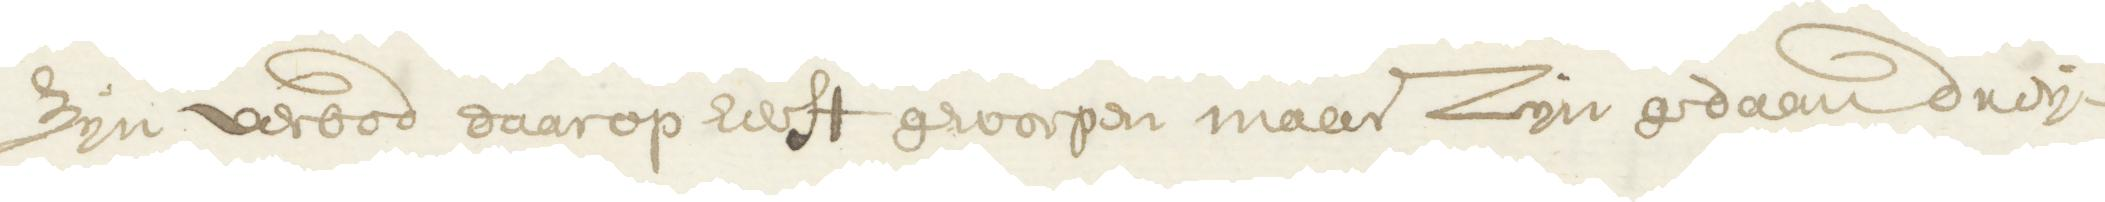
Zijn verbod daarop heft geworpen maar Zijn gedaan dreij„
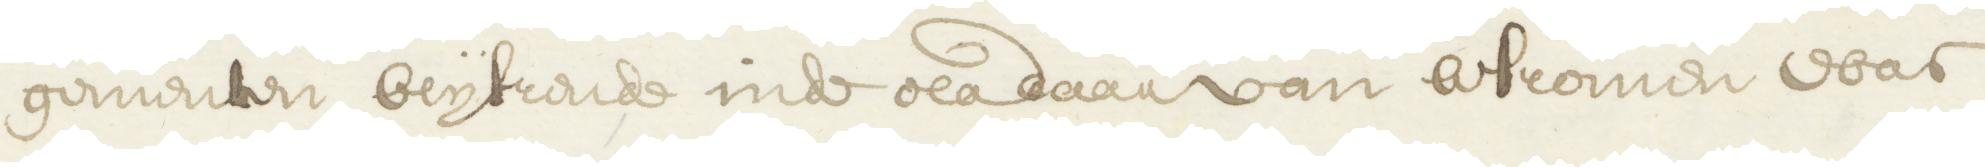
gementen blijkende inde ola daar van bekomen was
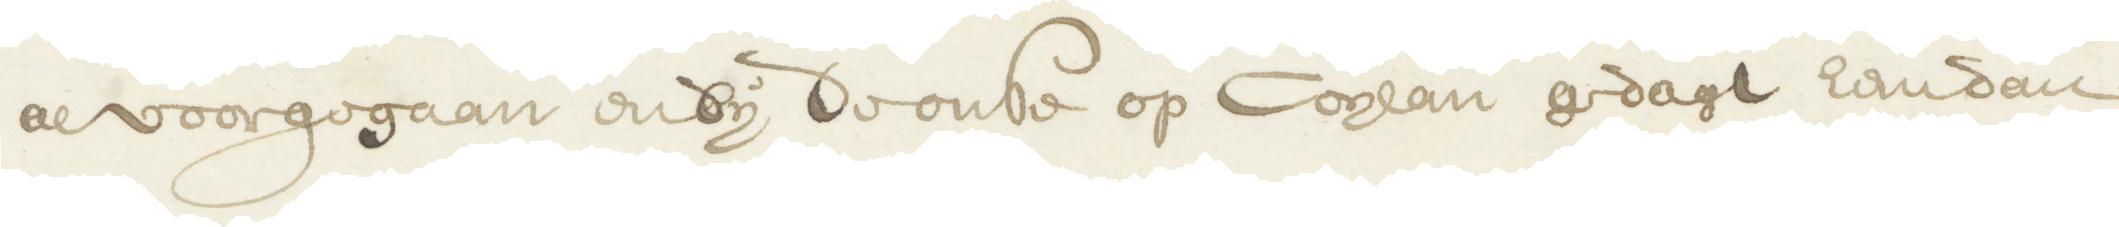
al voorgegaan en bij de onse op Coijlan gedagt hem dan
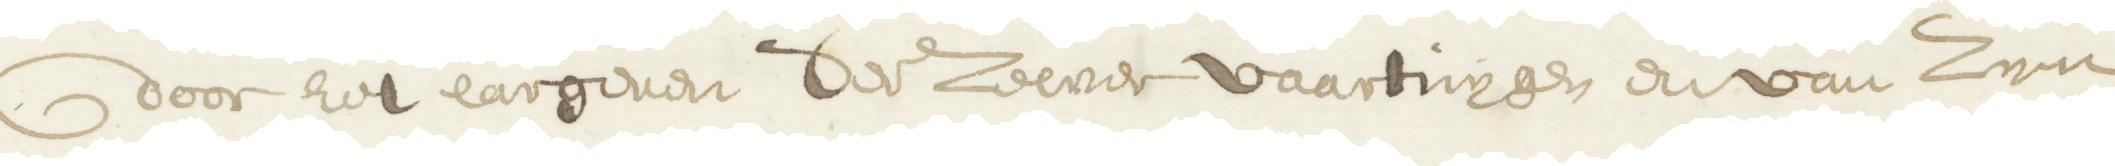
door het largeren derzelver vaartuijgen en van Zijn
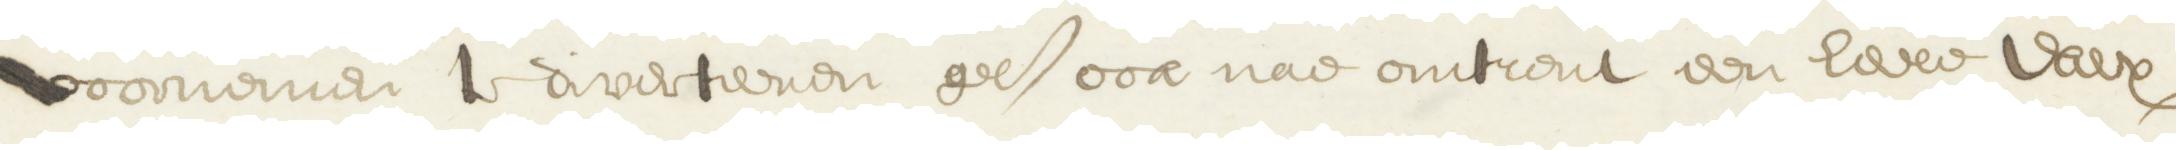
voornemen te diverteeren gelijk ook nae omtrent een heele weex
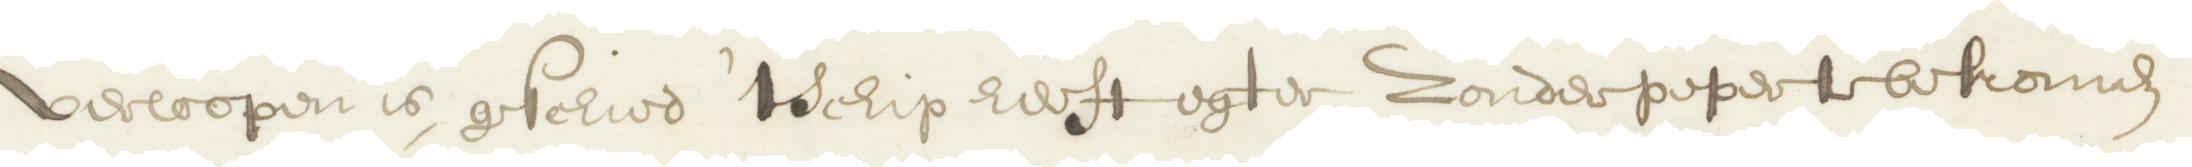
verloopen is, geschied 'tschip heeft egter Zonder peper te bekomen
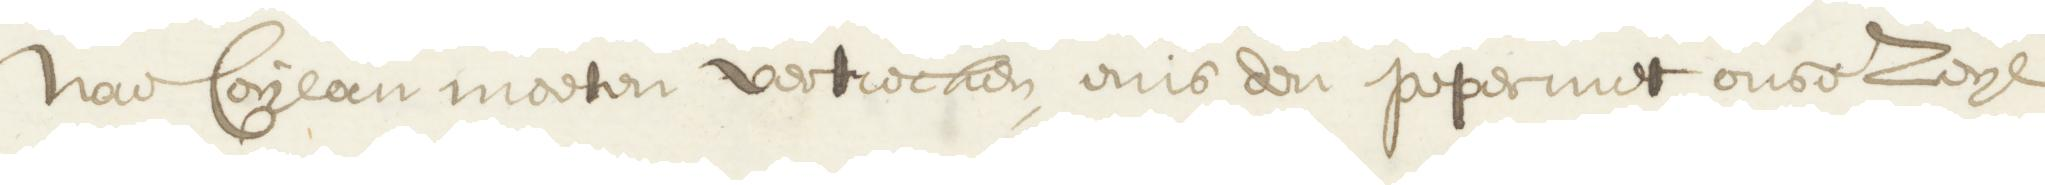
nae Coijlan moeten vertrecken en is den pepermet onse Zeyl
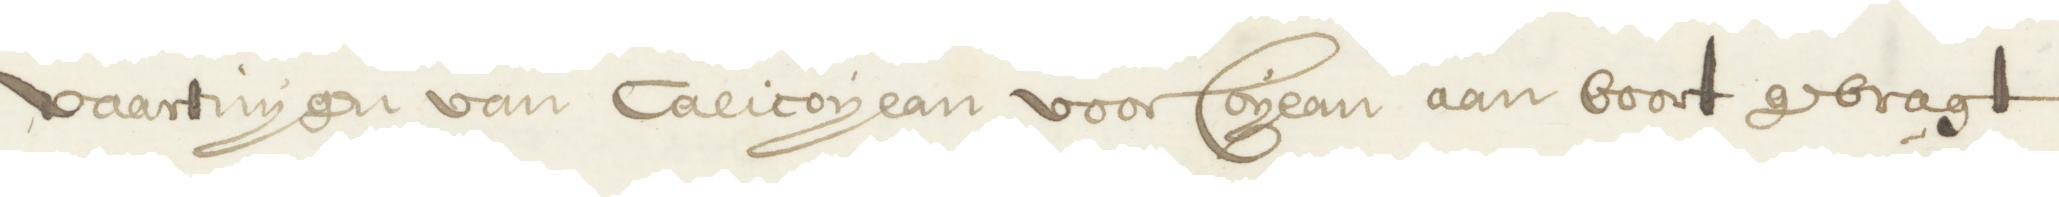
vaartuijgn van Calicoijlan voor Coijlan aan boort gebragt
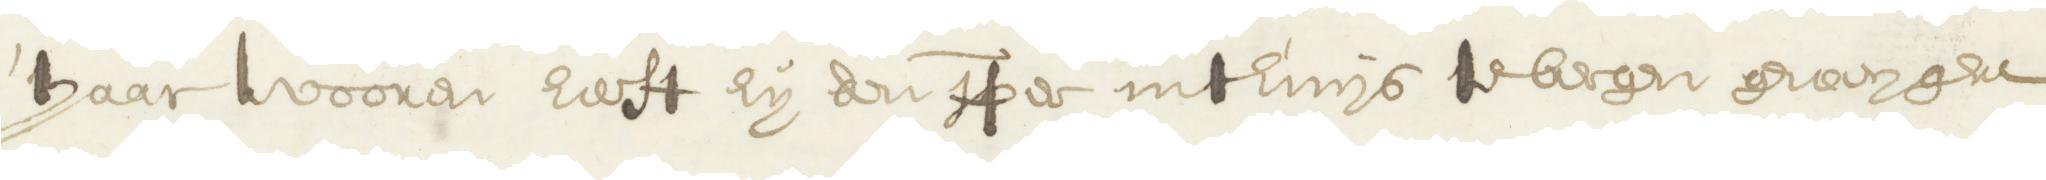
'tjaar tevooren heft hij den peper int huijs te bergen geweijgert
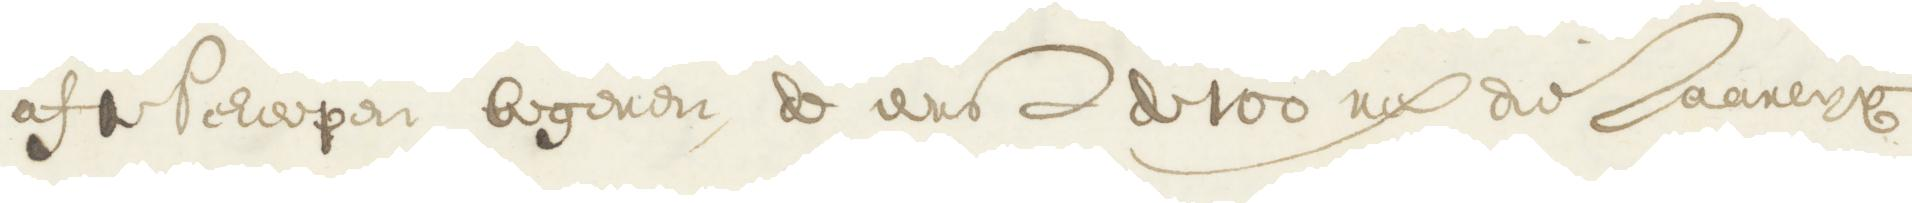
af te scheepen begeren, de eerst de 100 rx die Jaarlijx
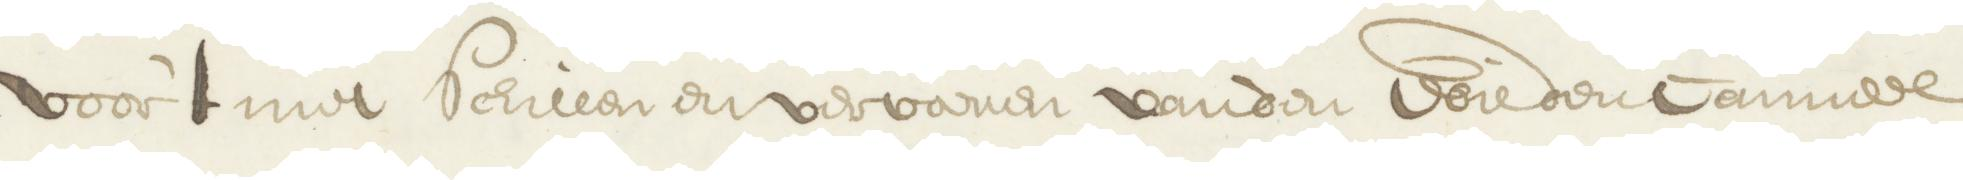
voor ’t niet schilen en vervoeren vanden wilden Caneel
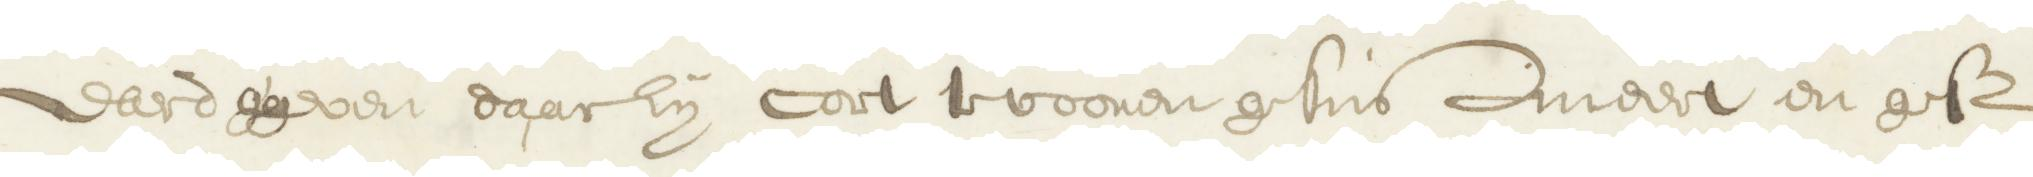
werd g'geven daar hij cort tevooren gesustineert en gess
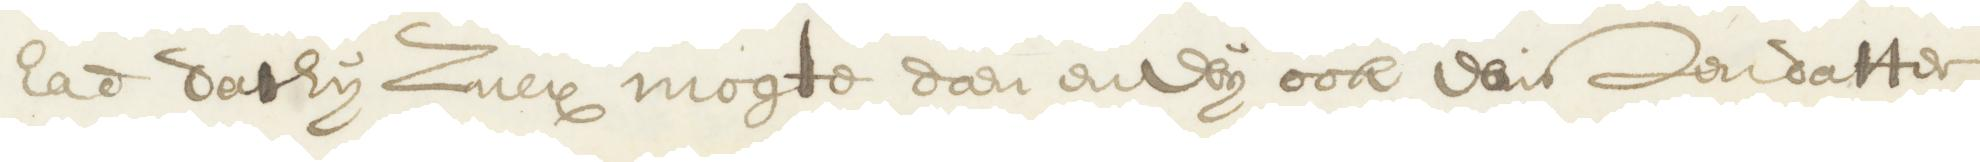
had dat hij Zulx mogte doen en wij ook wisten datter
